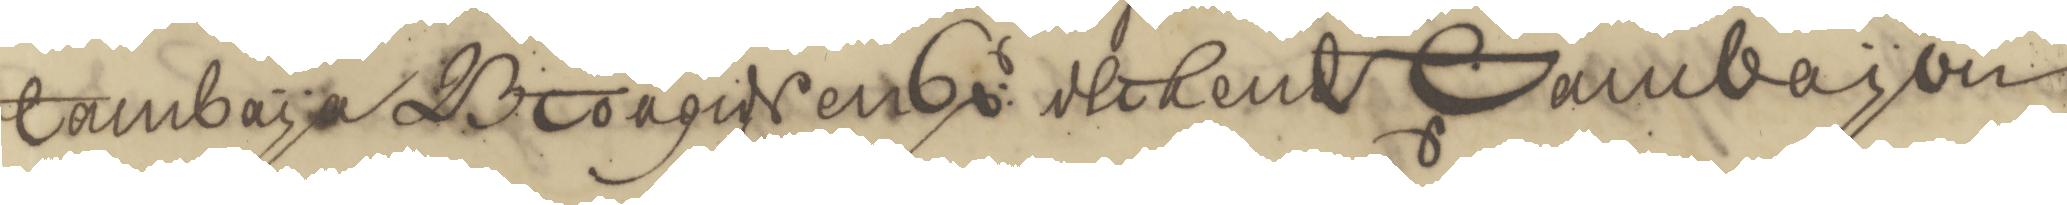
tambaija 23 corgies en 6 p:s elckende Cambaijen
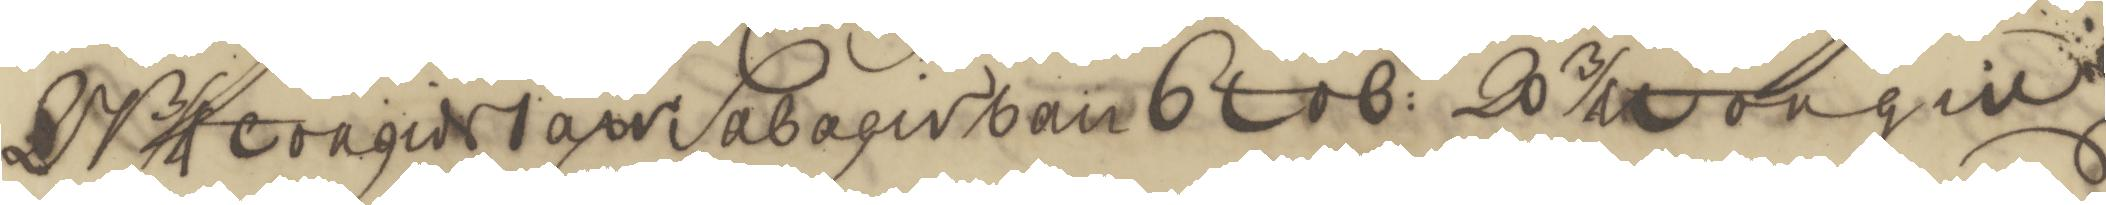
27¾ Corgies tape sabagie van 6 cob:s 20¾ corgie
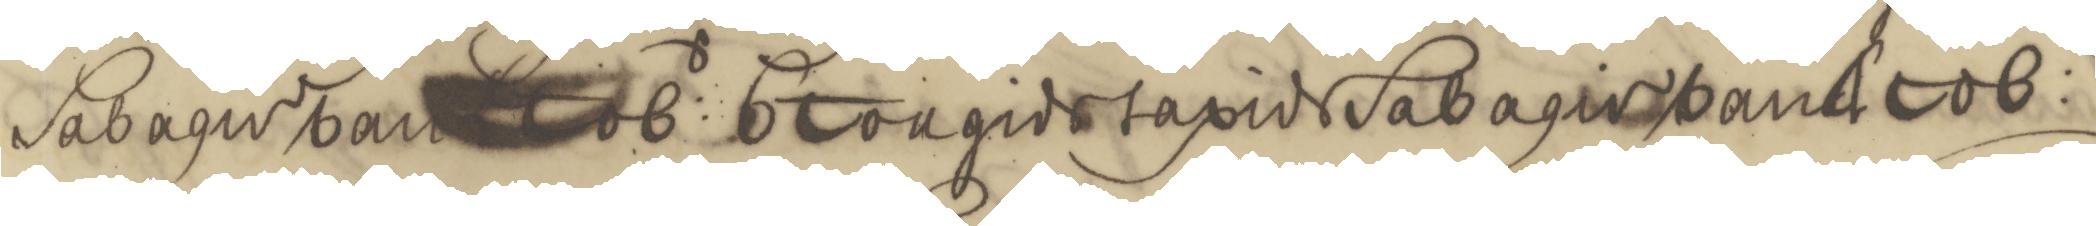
Sabagie van cob:s 6 corgies tapiessabagie van 4 cob:s
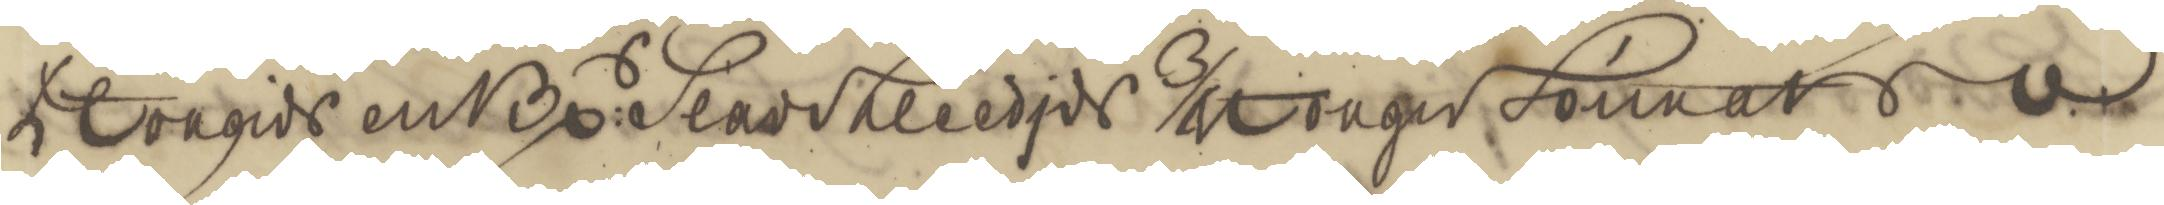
5 corgies en 13 p:s slaedkleedjes ¾ corgie souratse
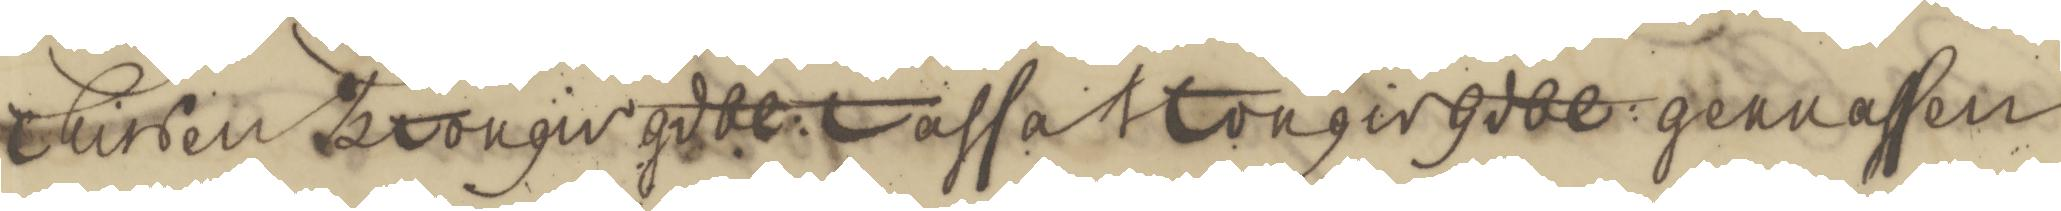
chitsen ½ corgie gebl: Cassa 1 Corgie gebl: gerrassen
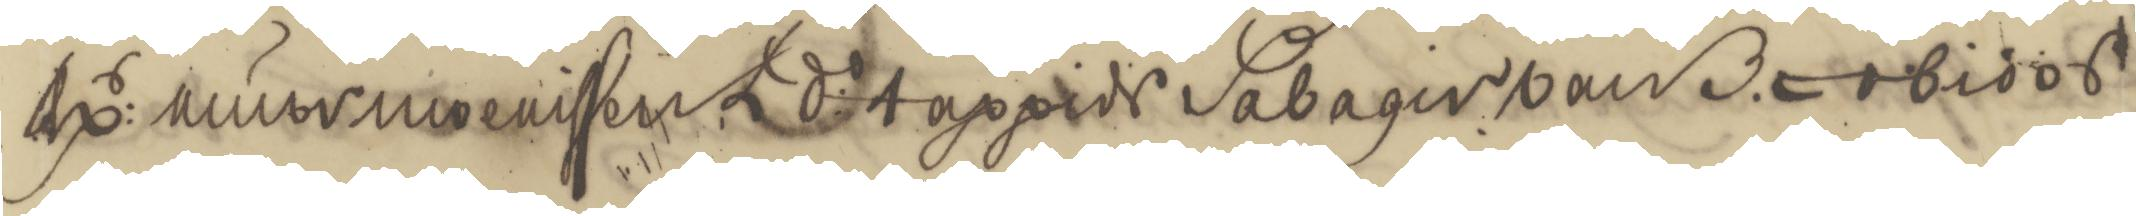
4 p:s ruwe moerissen 5 d:o tappies Sabagie van 3. cobidos
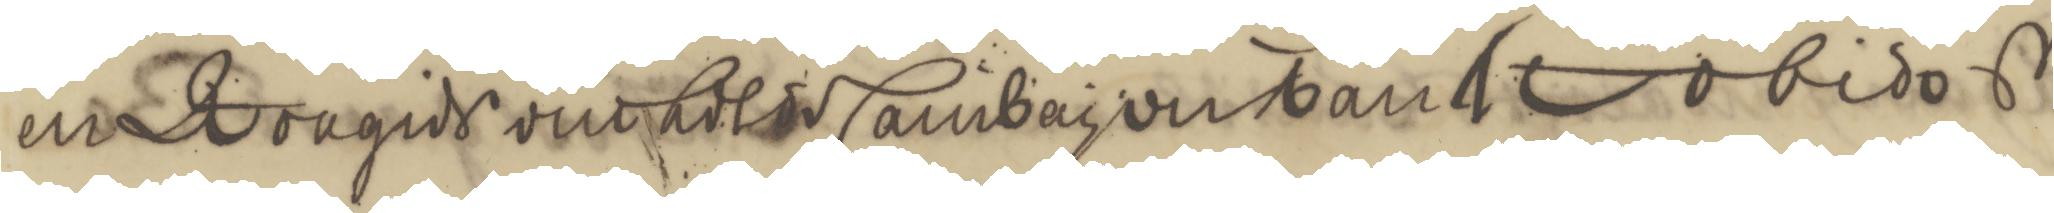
en 2 corgies enckelde Cambaijen van 4 Cobidos
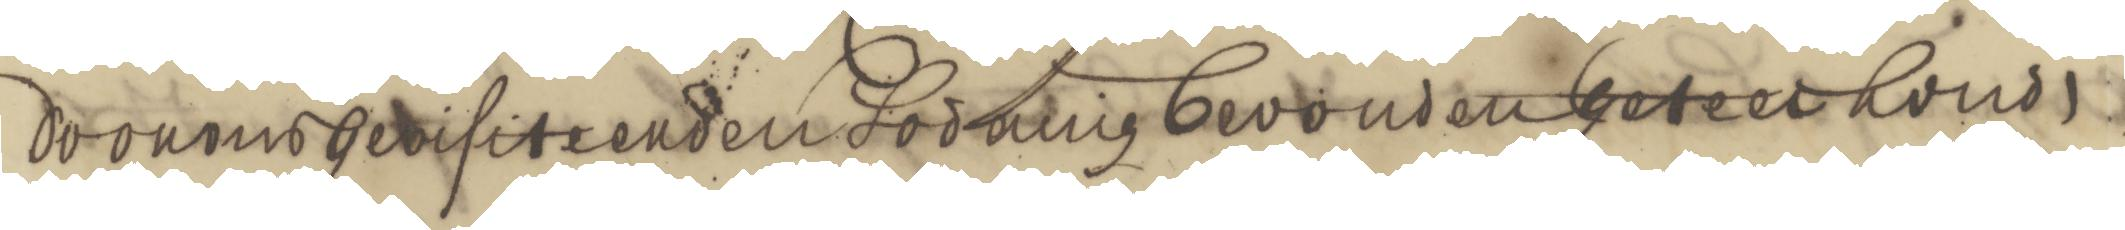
dooronsgevisiteerd en sodanig bevonden (geteeckend)
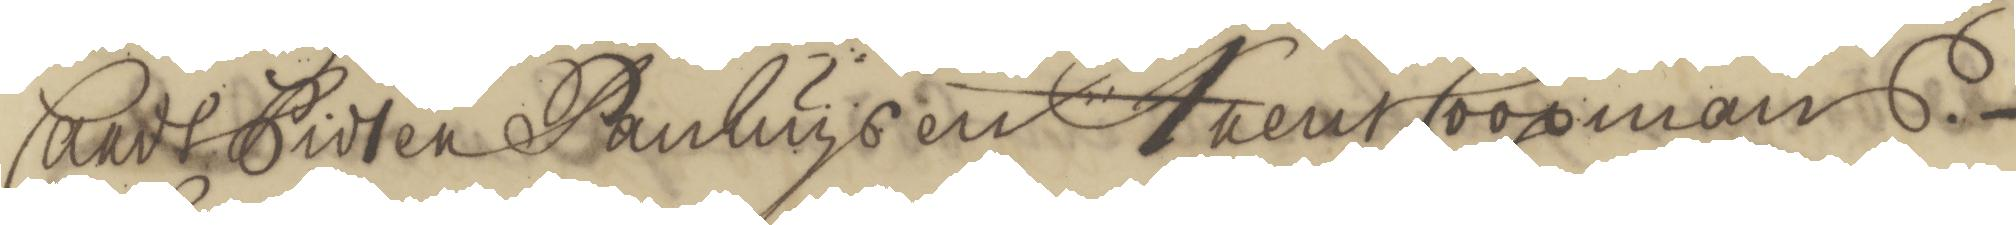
Carel Pieter Panhuijs en Arent Coopmans
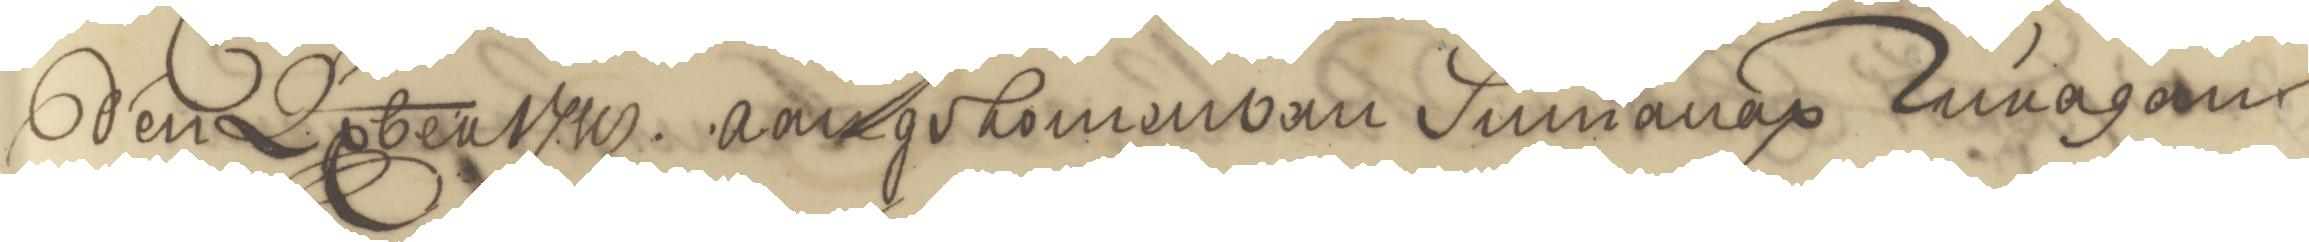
den 2 xber 1718. aangekomen van Sumanap Iuragan
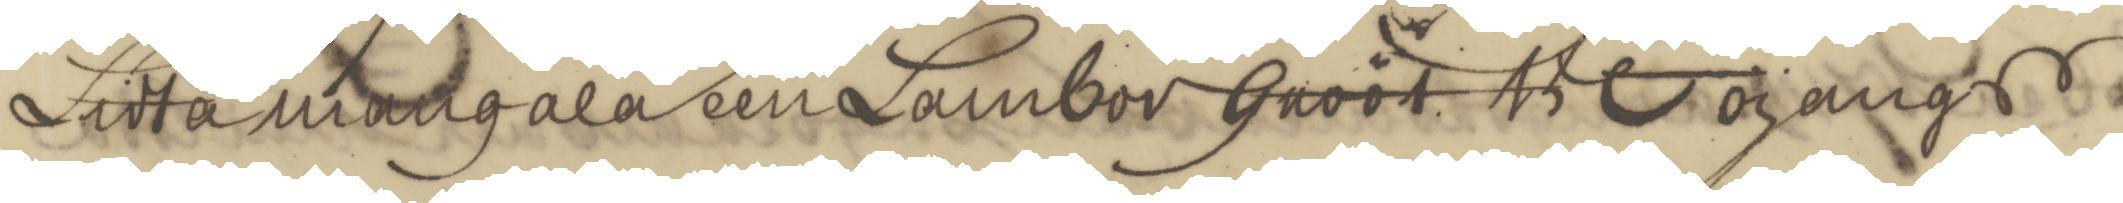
Lieta mangala een Lamboe groot 15 Coijangs
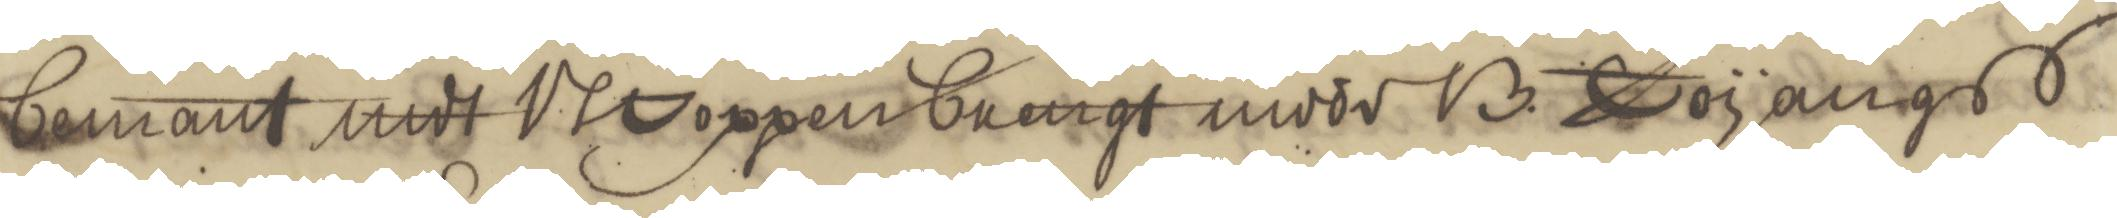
bemant met 17 Coppen brengt mede 13. Coijangs
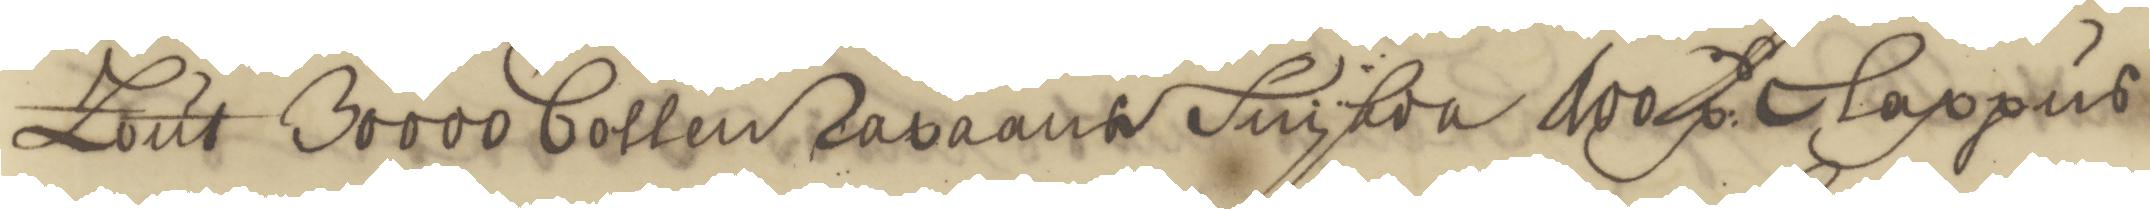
zout 30000 bollen Iavaanse suijker 400 p:s Clappus
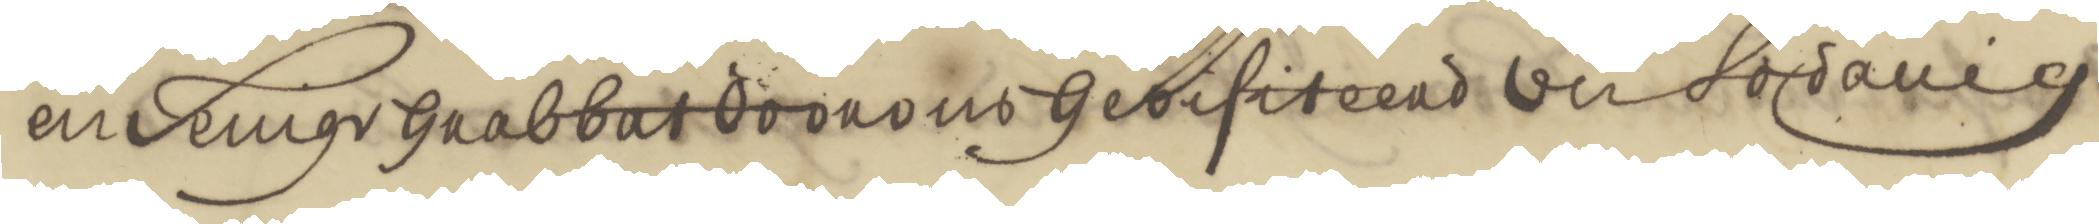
en Eenige grabbat doorons gevisiteerd en sodanig
